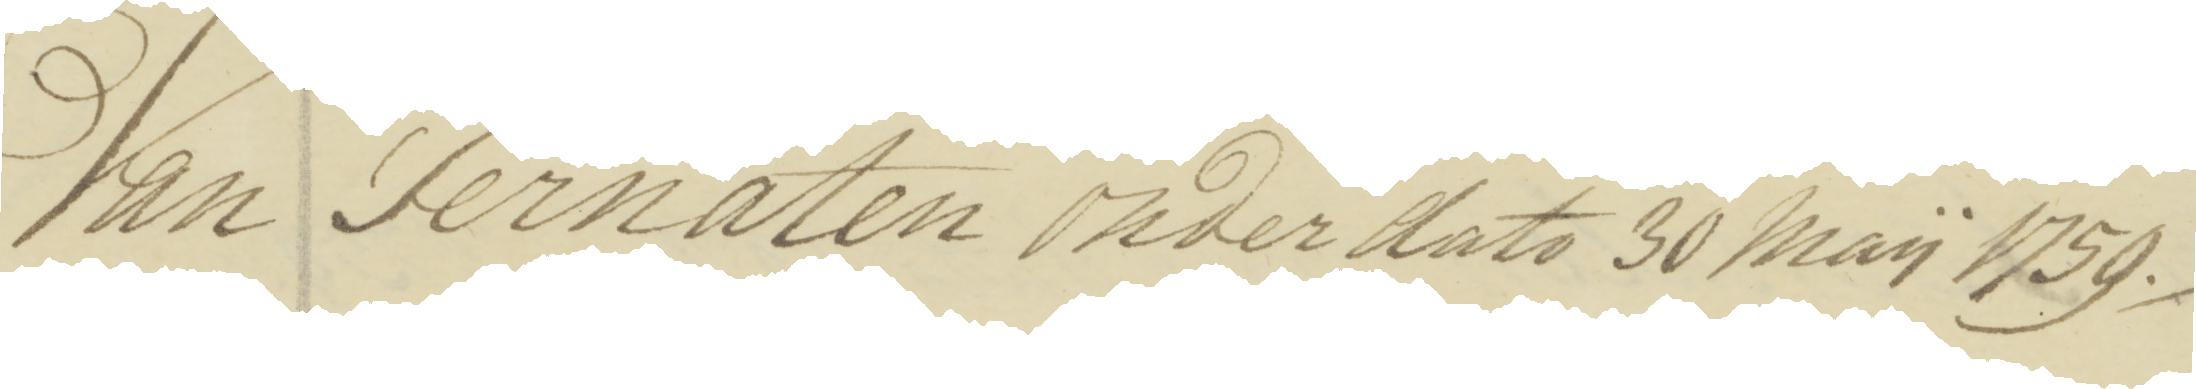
Van Ternaten onder dato 30 Maij 1759.
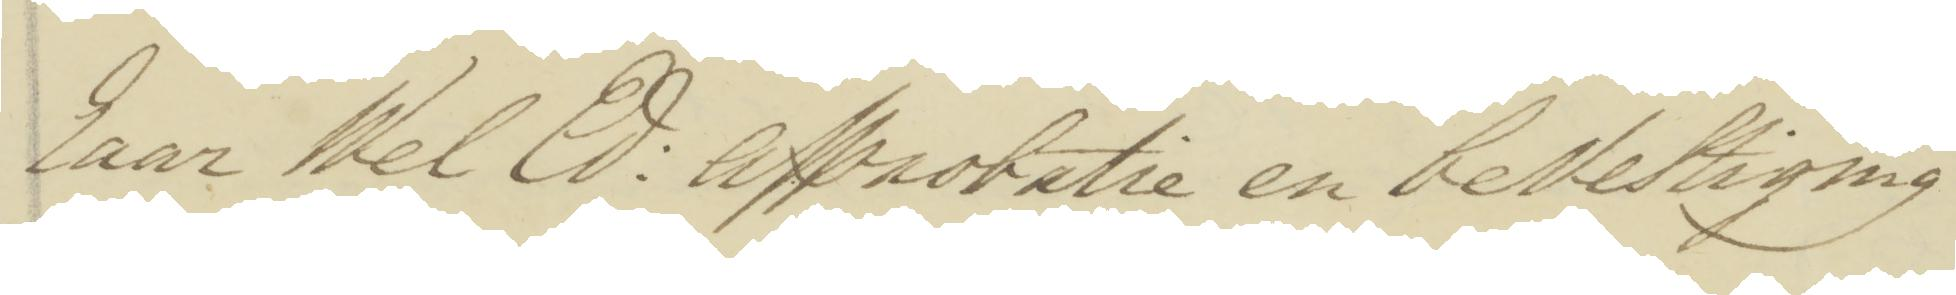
haar Wel Ed: approbatie en bevestiging
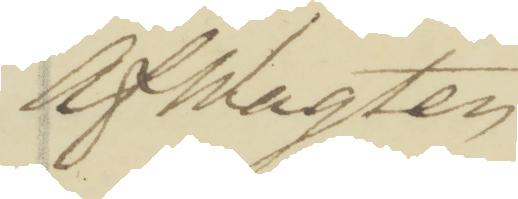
Afwagten
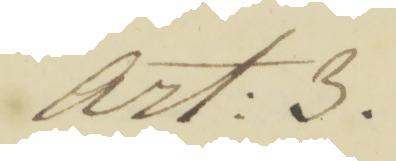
art: 3.
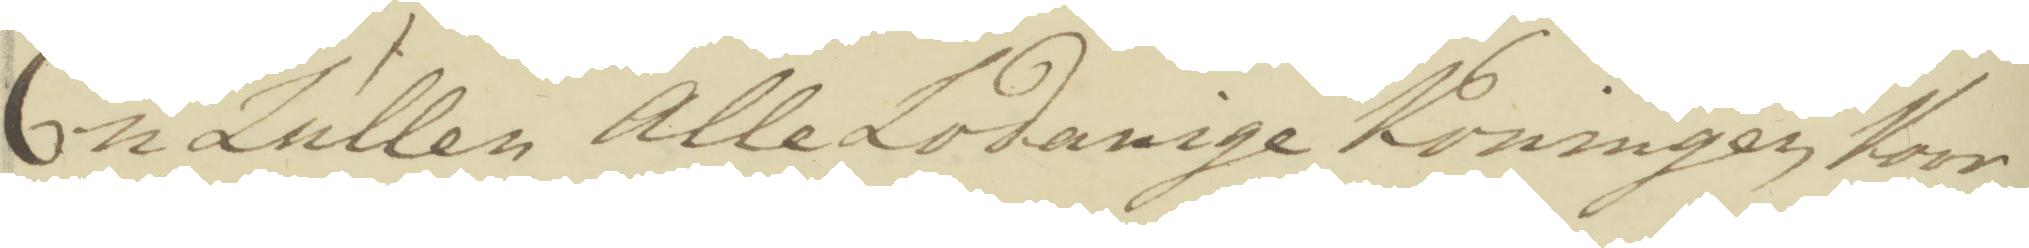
en zullen alle zodanige Koningen voor
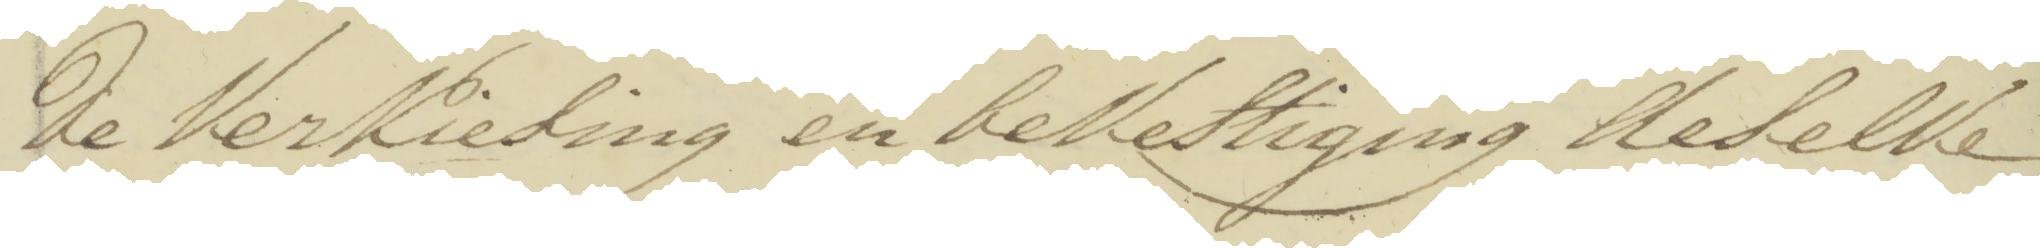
de verkiesing en bevestiging deselve
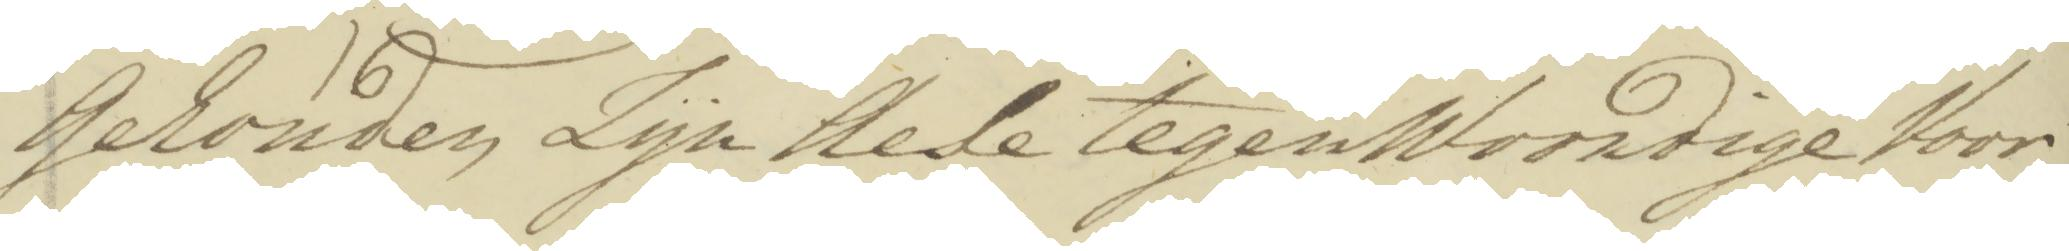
gehouden zijn dese tegenwoordige voor
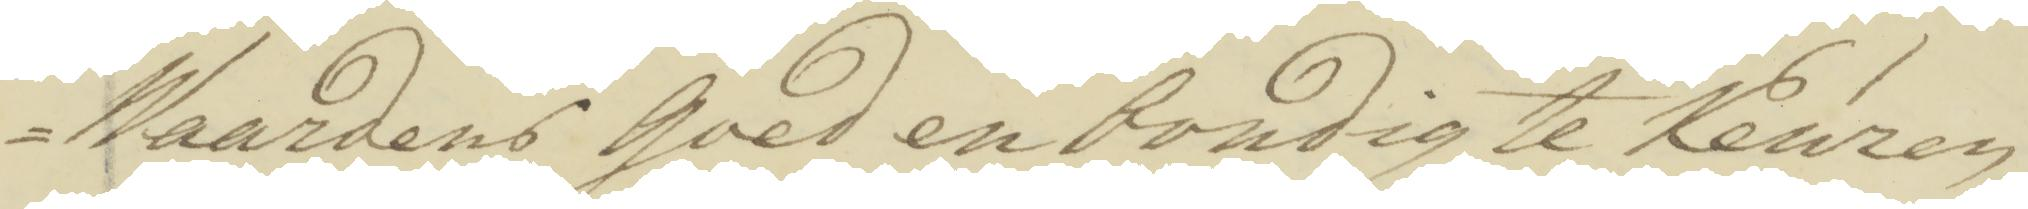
=waardens goed en bondig te keuren
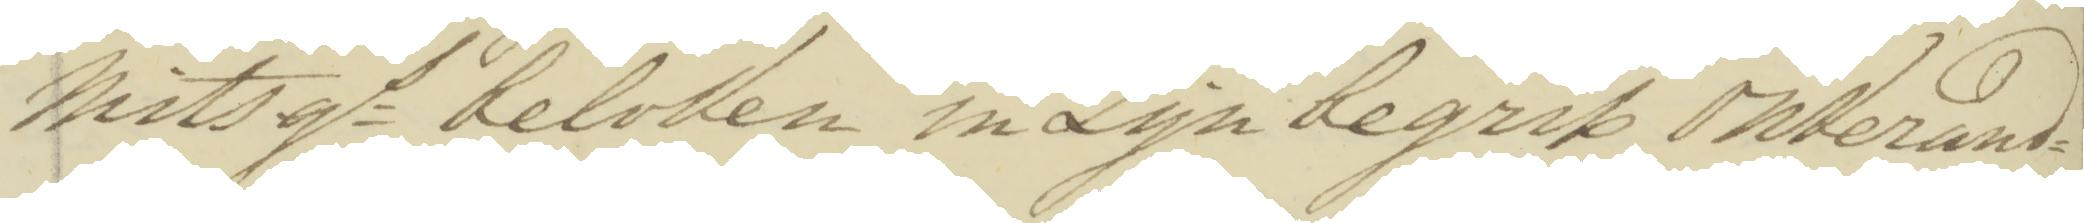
mitsg=s beloven in zijn begrip onverand=
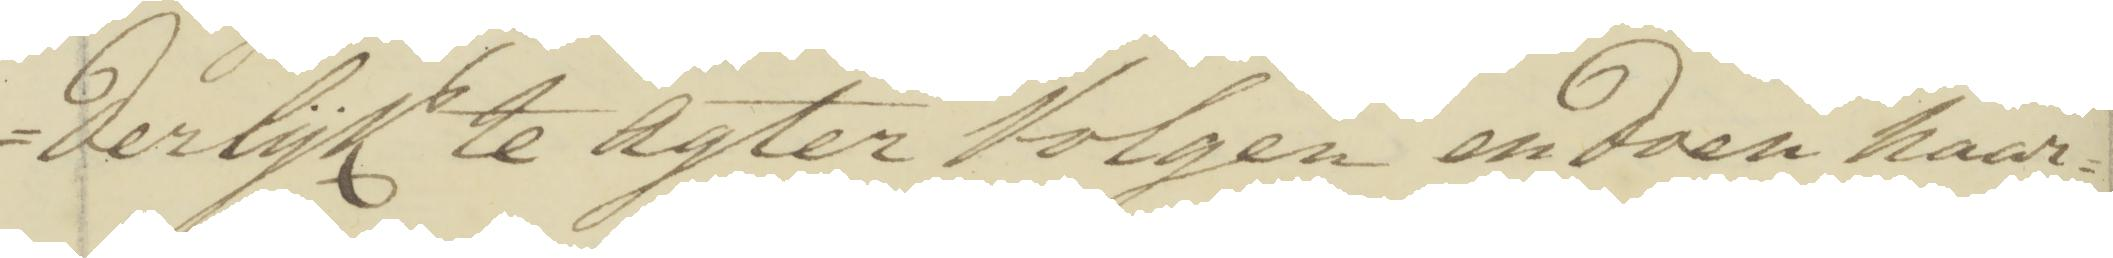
=derlijk te agter volgen en doen naar=
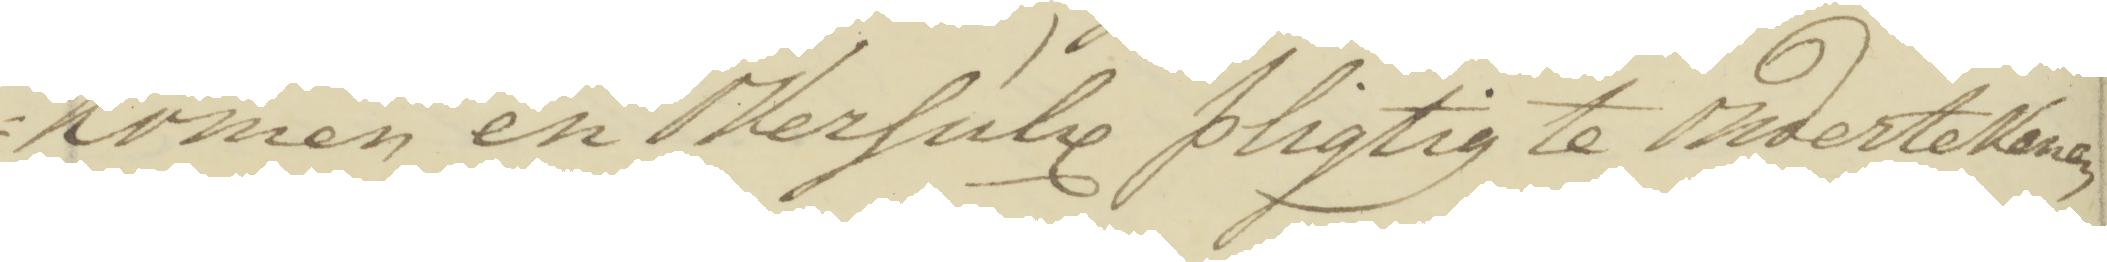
=komen en oversulx pligtig te ondertekenen
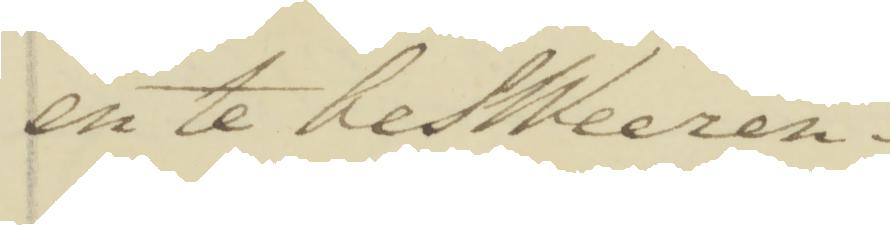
en te besweeren.
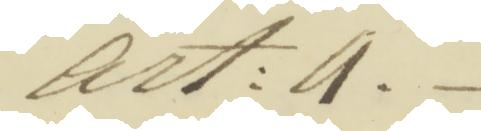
art: 4. —
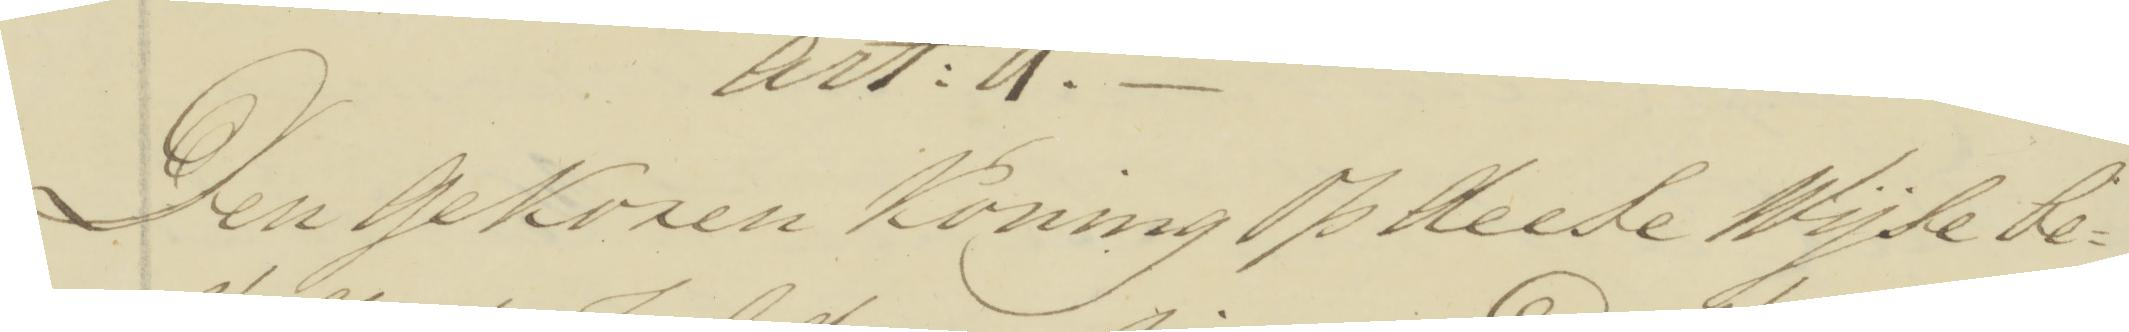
Den gekozen Koning op deese wijse be=
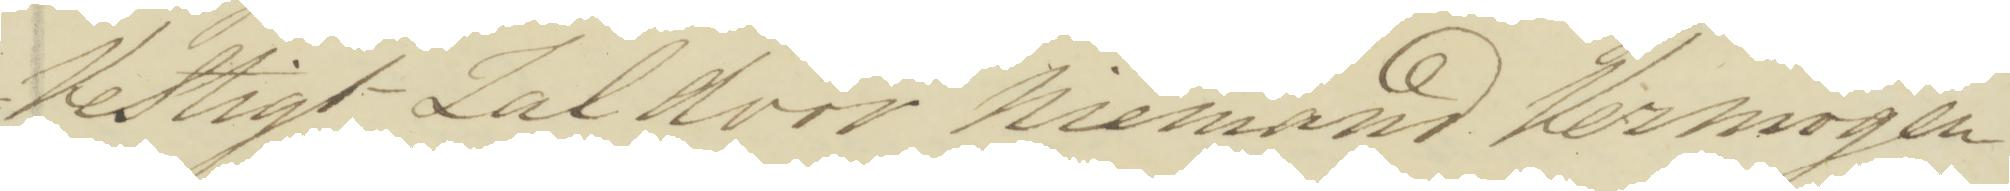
vestigt zal door niemand vermogen
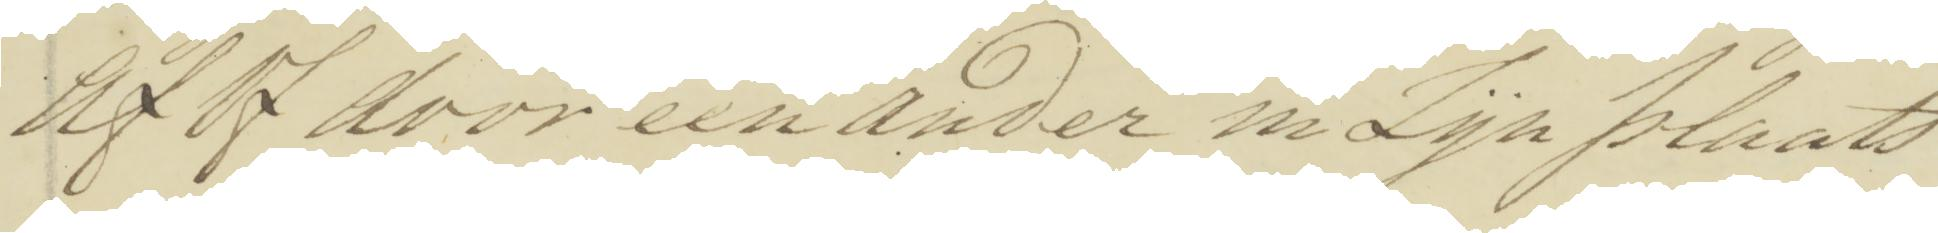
af of door een ander in zijn plaats
